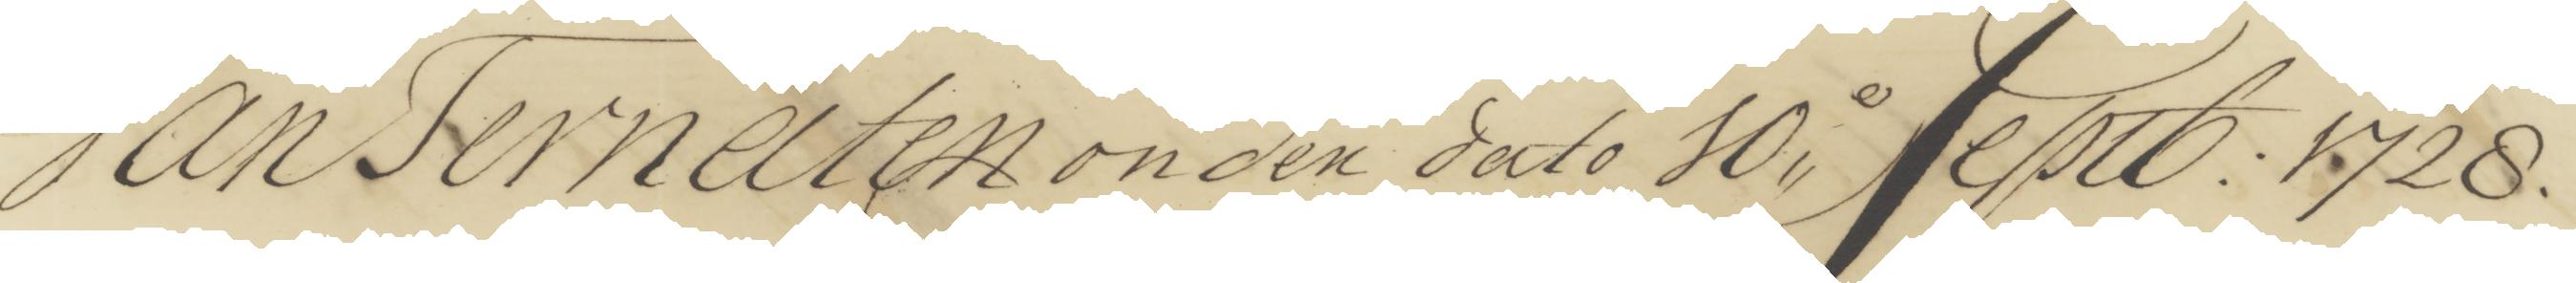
Van Ternaten onder dato 10„e Septb: 1728.
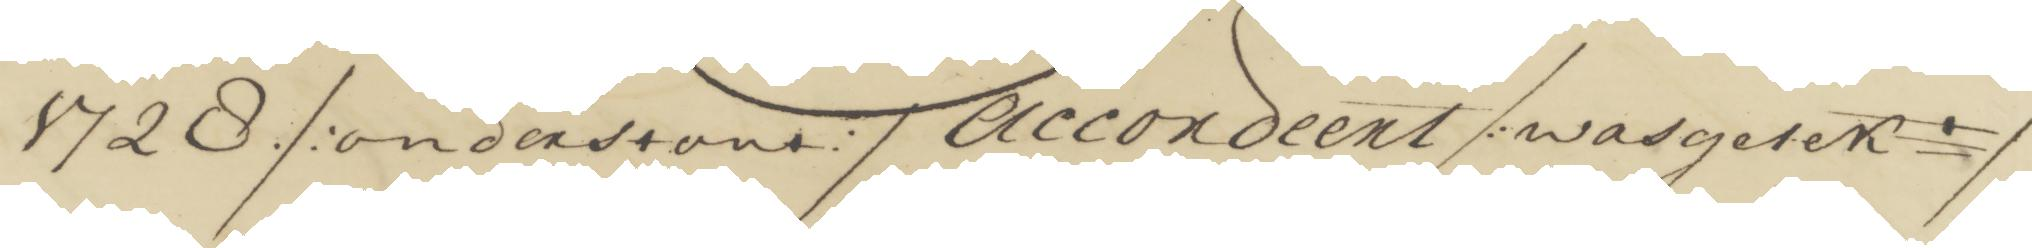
1728 /:onderstont:/ accordeert /:was getek=t/
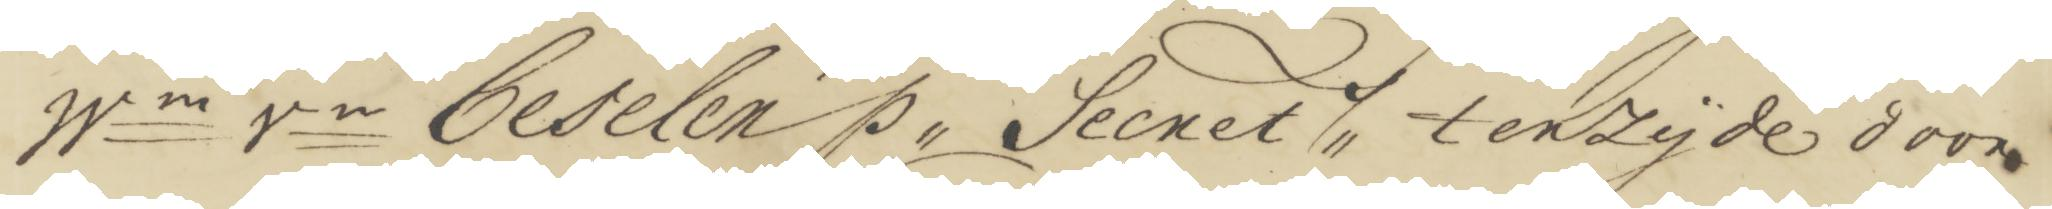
W=m V=n beseler p„l Secret„s ter zijde door
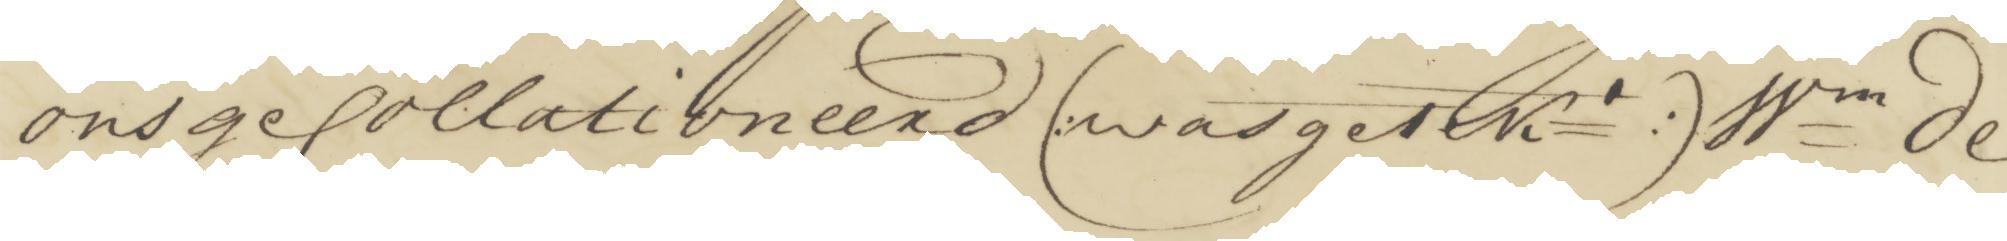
ons gecollationeerd (was getek=t:) W=m de
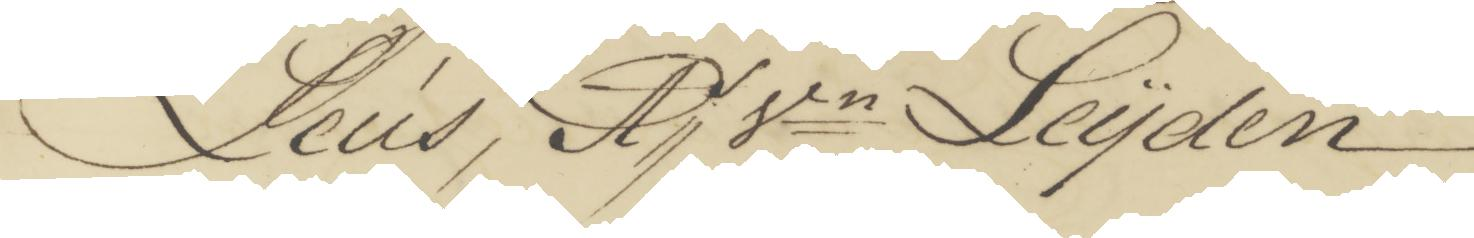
Leus, A„s V=n Leijden.
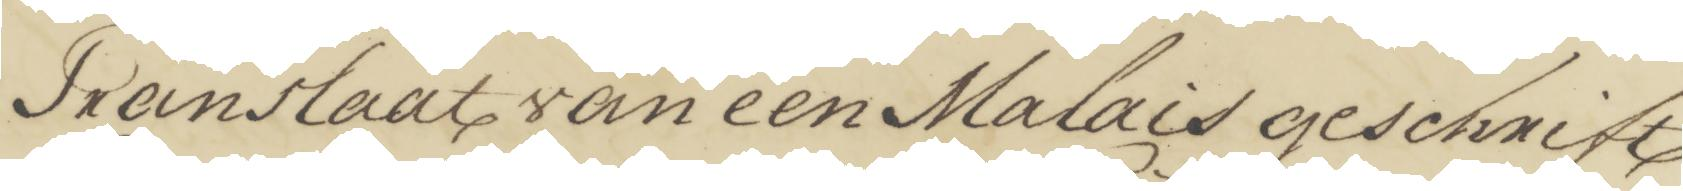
Translaat van een Malais geschrift
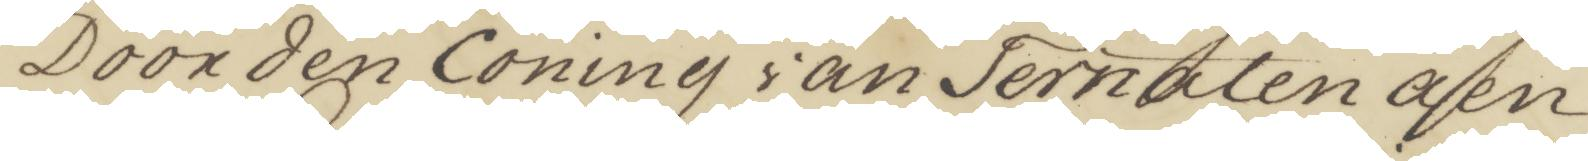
Door den Coning van Ternaten aen
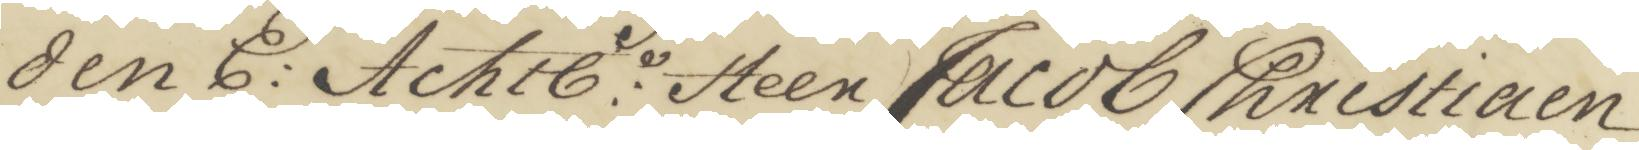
den E: Achtb:e Heer Jacob Christiaen
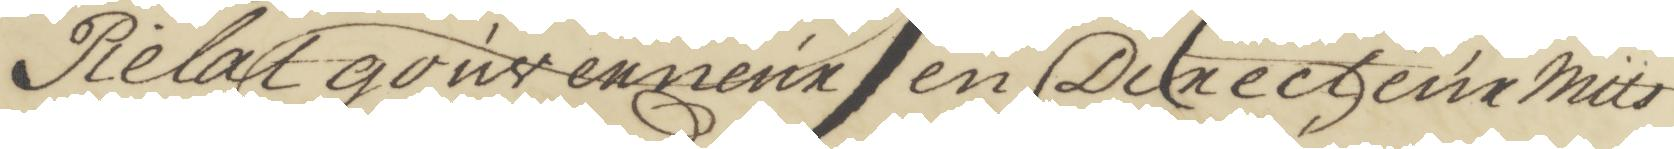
Pielat gouverneur en Directeur mits
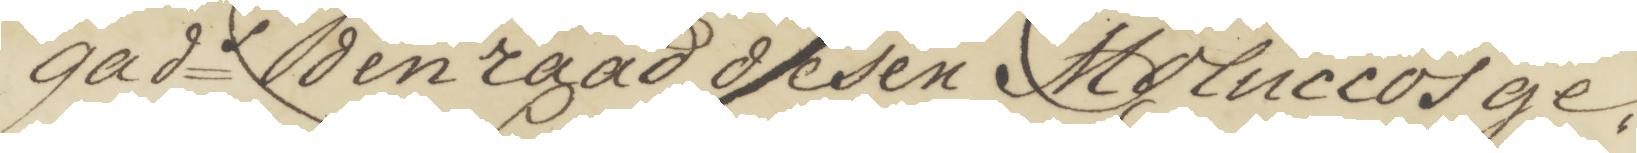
gad=s den raad deser Moluccos ge„
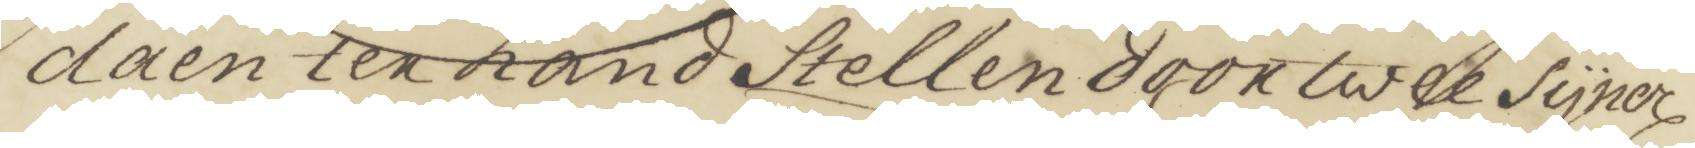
daen ter hand Stellen door twee Sijner
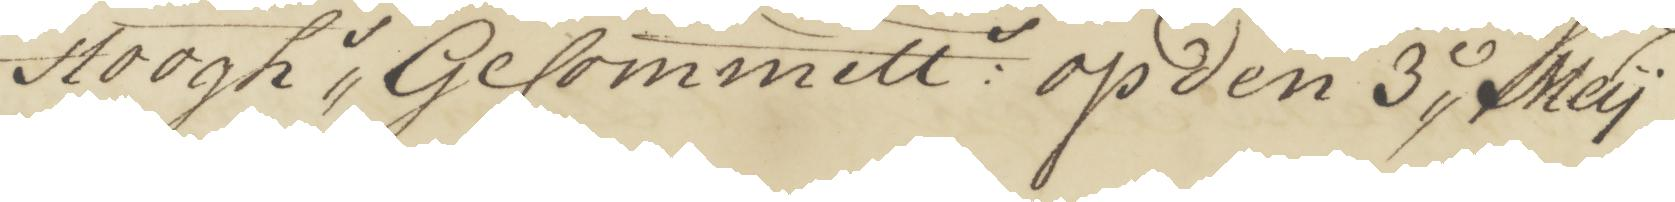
Hoogh„s Gecommitt:s op den 3„e Meij
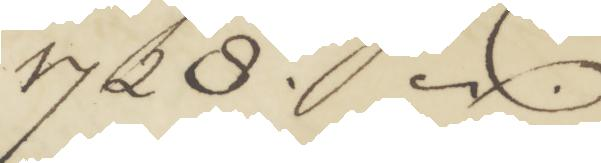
1728.
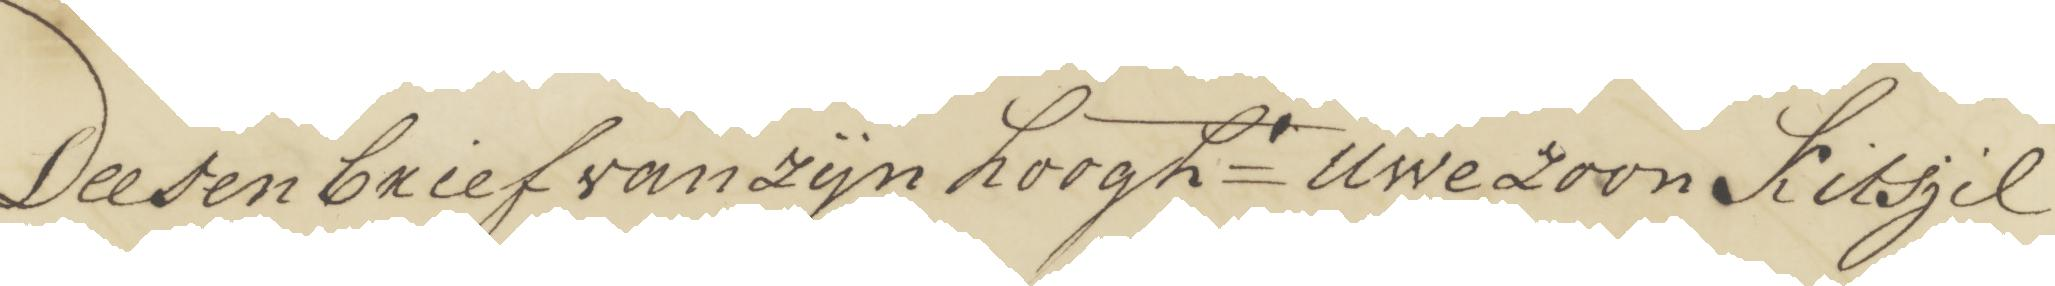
Deesen brief van zijn hoogh=t uwe zoon Kitsjil
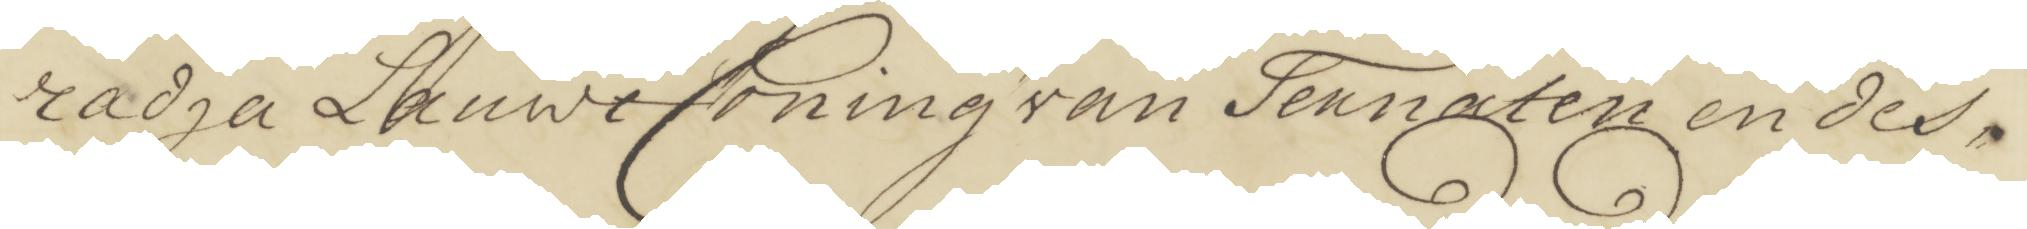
radja Lauwt Coning van Ternaten en des„
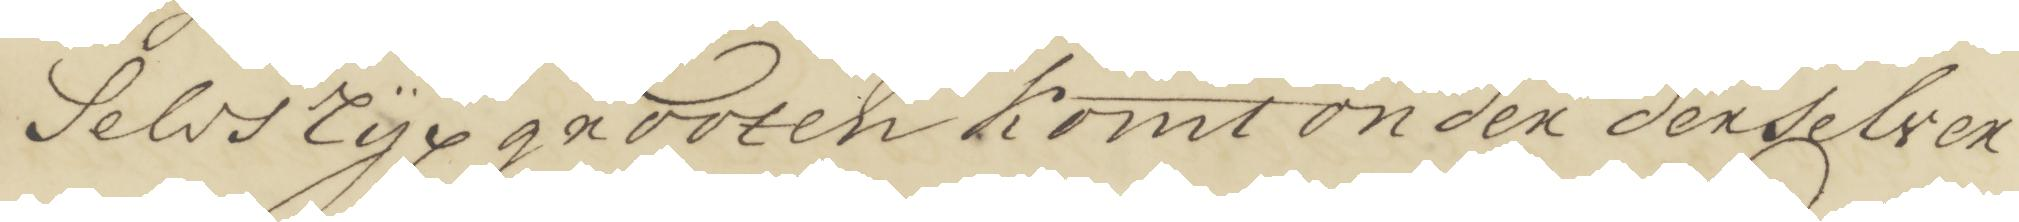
Selvs rijx grooten komt onder derselver
